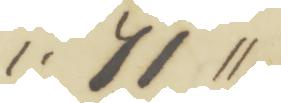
„ 71 „
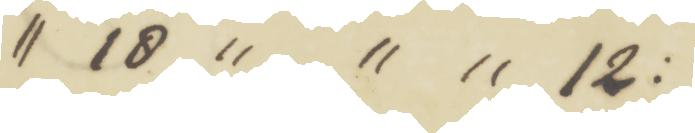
„ 18 „ „ „ 12:
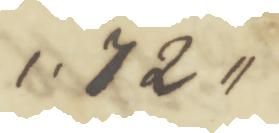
„ 72 „
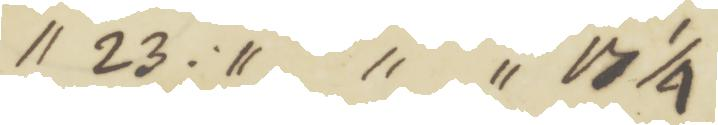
„ 23. „ „ „ 17¼
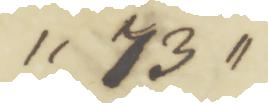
„73„
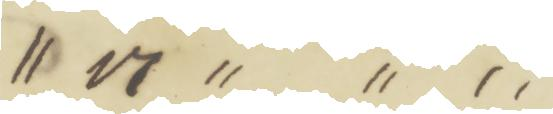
„ 17 „ „ „
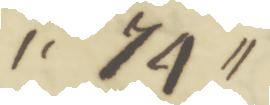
„ 74 „
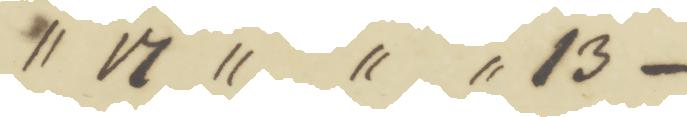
„ 17 „ „ „ 13—
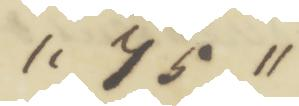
„ 75 „
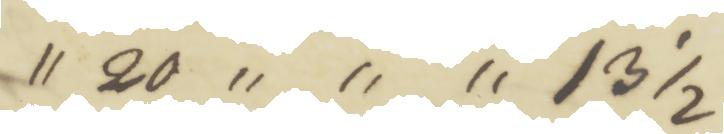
„ 20 „ „ „ 13 ½
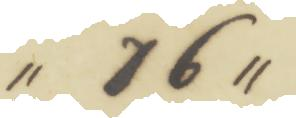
„ 76 „
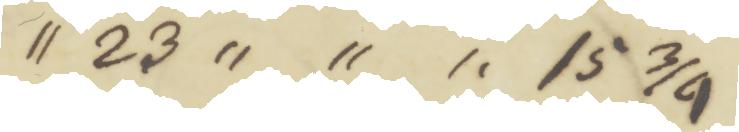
„ 23 „ „ „ 15 ¾
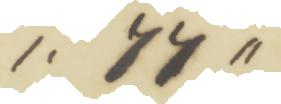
„ 77 „
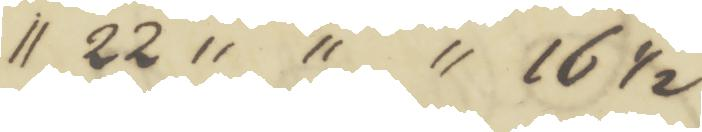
„ 22 „ „ „ 16½
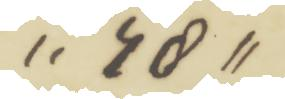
„ 78 „
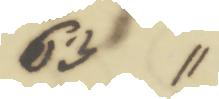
63 „
